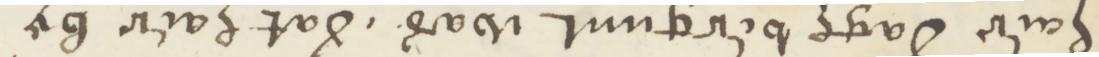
haer dagh vergunt was, dat haer bij
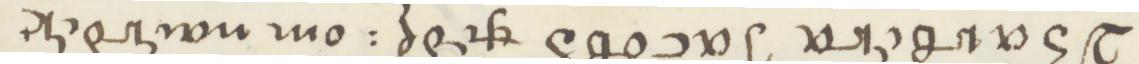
Barbera Iacobs gedh:e om naerder
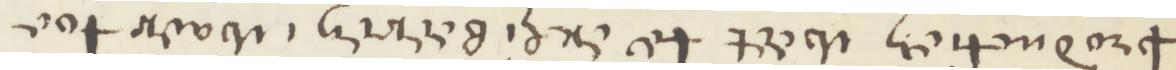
productien weet te exhibeeren, waer toe
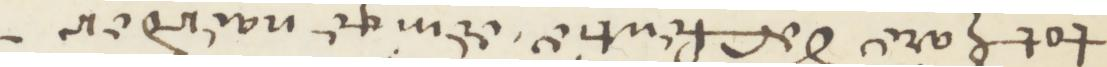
tot hare deffentie, eenige naerder
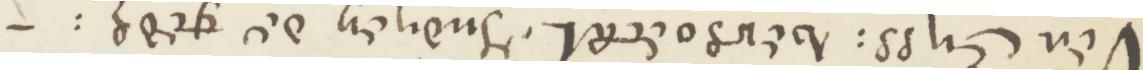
Den Eijss:r versoeckt, Indijen de gedh:de —
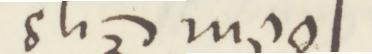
Jdem Eijsr
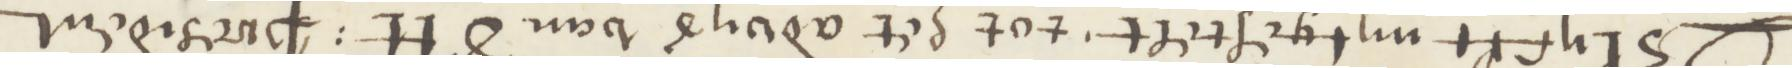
Blijfft uijtgestelt tot het advijs van d' 11:e president
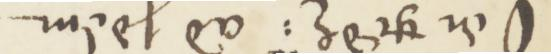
Den gedh:r ad jdem
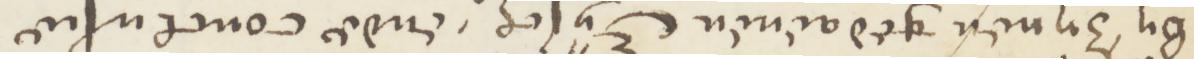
bij zijnen gedaenen Eijsch, ende conclusie
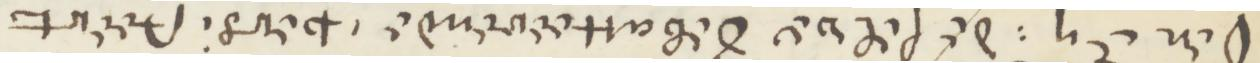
Den Ey:r de selve debatteerende, persisteert
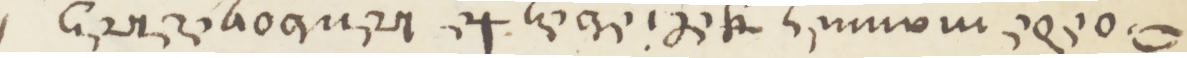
Goede mannen gelieven te renvoijeeren
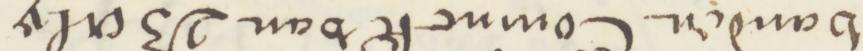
vanden Coninck van Balij
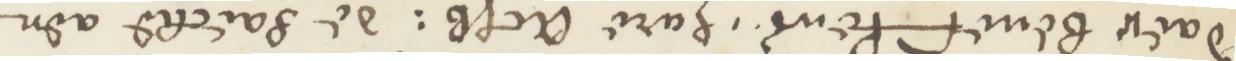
daer beneffens hare Achb:re de saecke aen
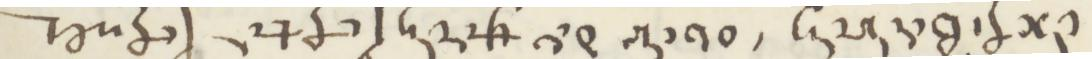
Exhibeeren, over de geeijschte schult
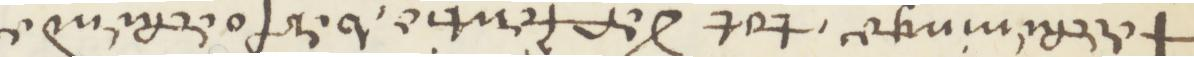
teeckeninge, tot deffentie, versoeckende
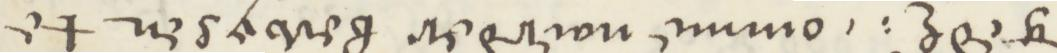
gedh:e omme naerder bewijsen te
